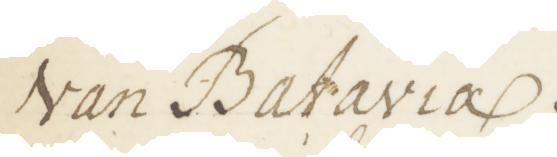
van Batavia.
